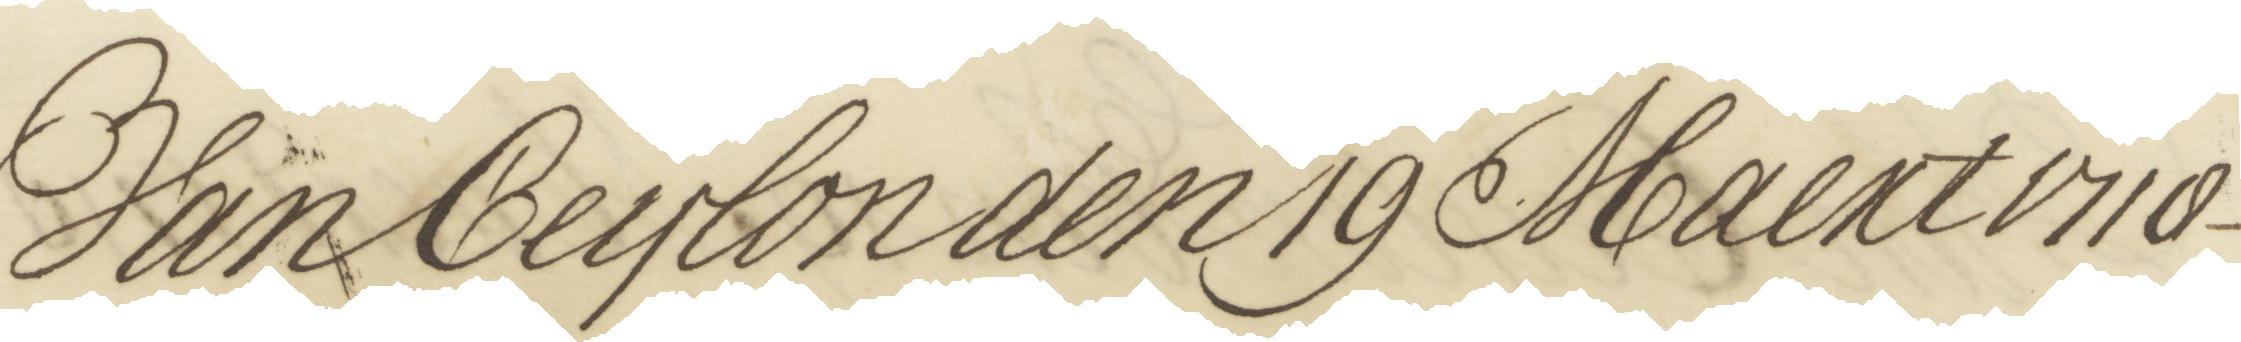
Van Ceijlon den 19 Maert 1718
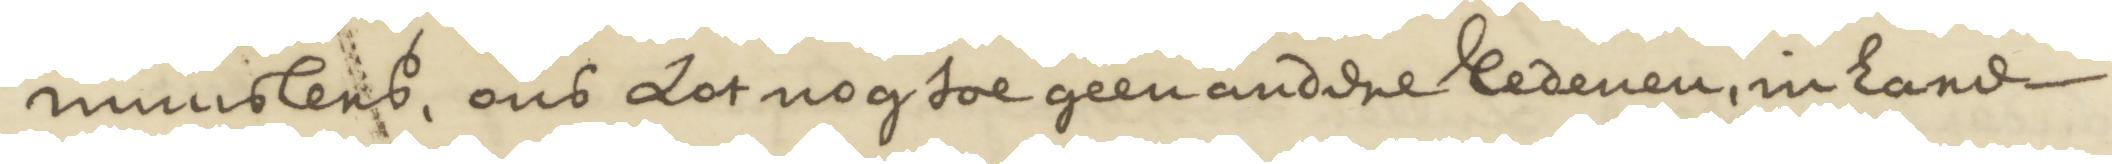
ministers, ons tot nog toe geen andere Redenen, in hare
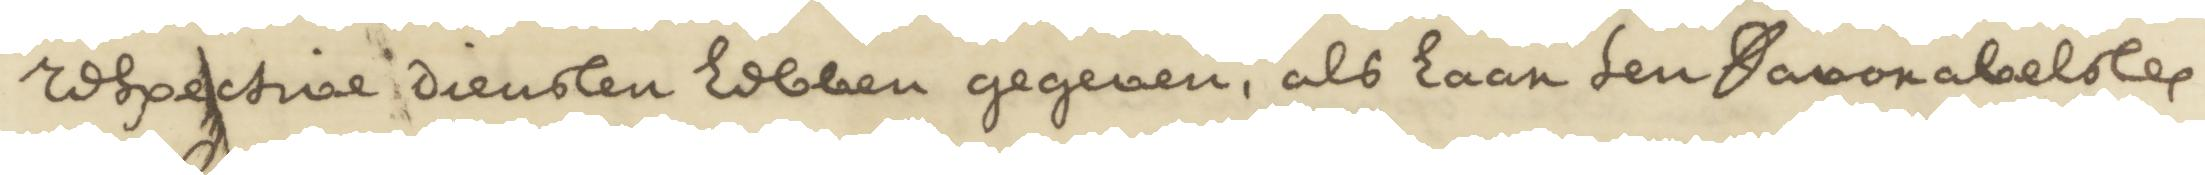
respective diensten hebben gegeven, als haar ten favorabelste
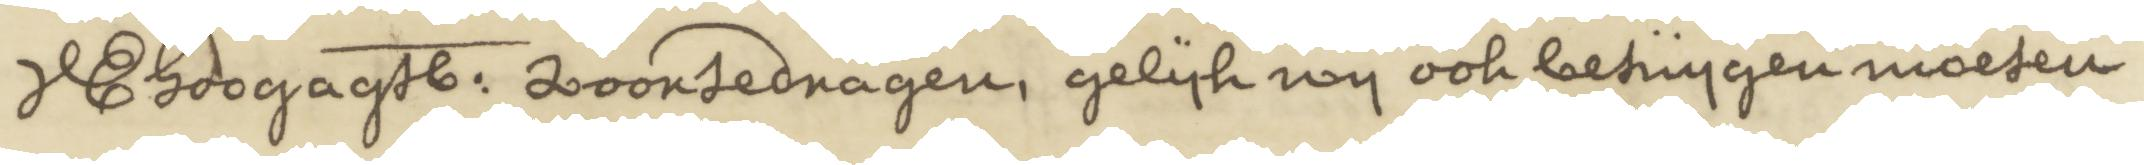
VE hoog agtb: voor te dragen, gelijk wij ook betuijgen moeten
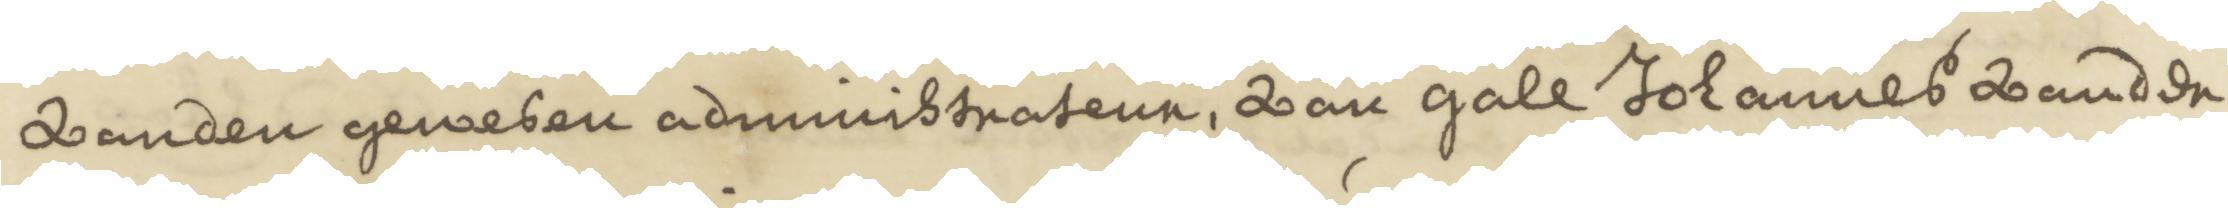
van den gewesen administrateur, van gale Iohannes van der
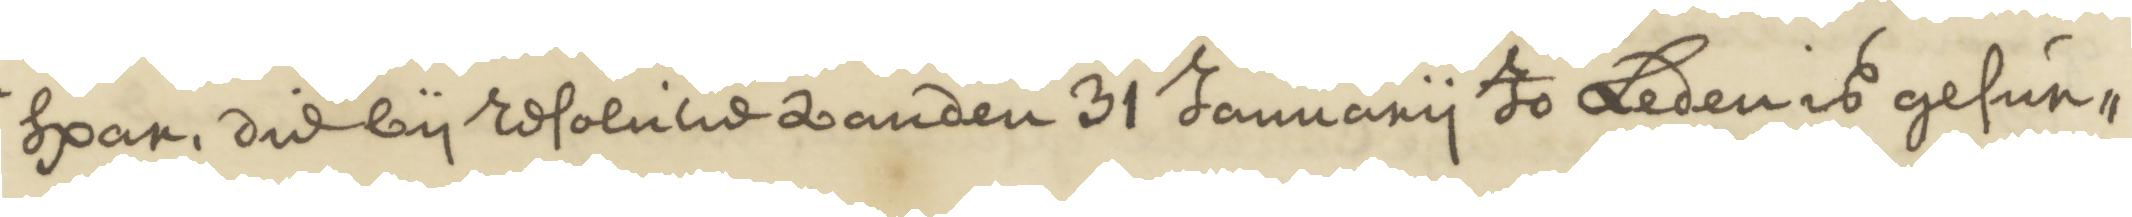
spar, die bij resolutie van den 31 Ianuarij Io Leden is gesur„
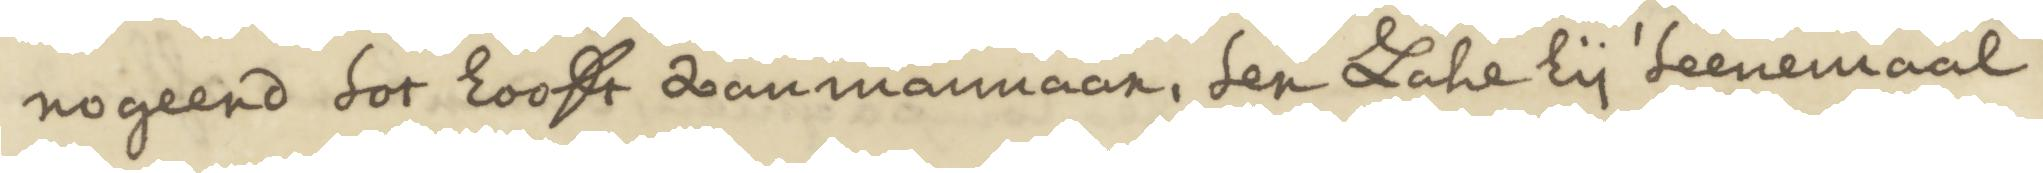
rogeerd tot hooft van mannaar, ter zake hij 'teenemaal
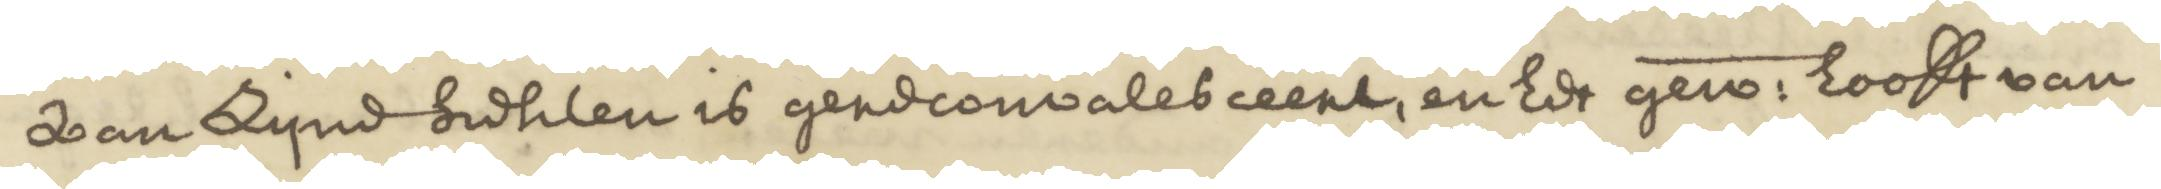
van zijne siekten is gereconvalesceert, en het gew: hooft van
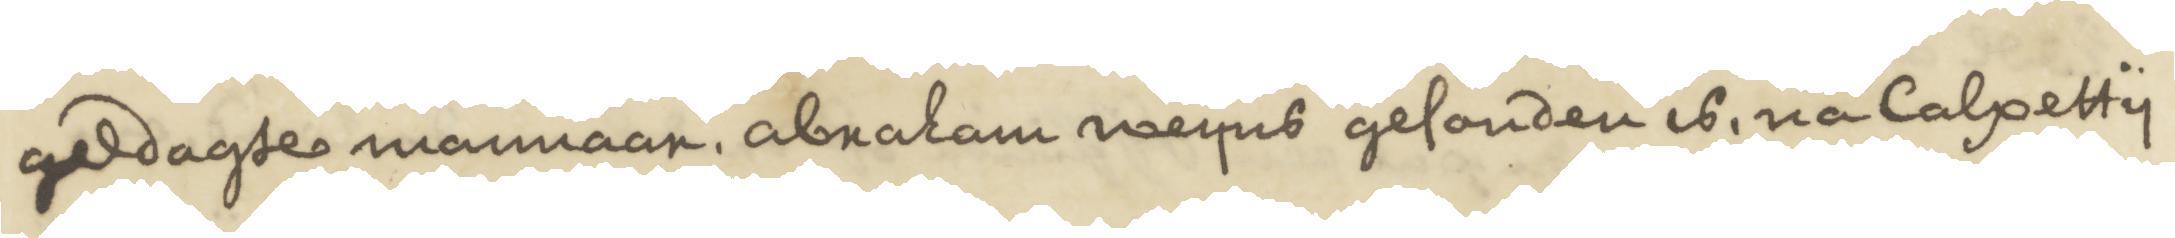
gedagte mannaar, abraham weijns gesonden is, na Calpettij
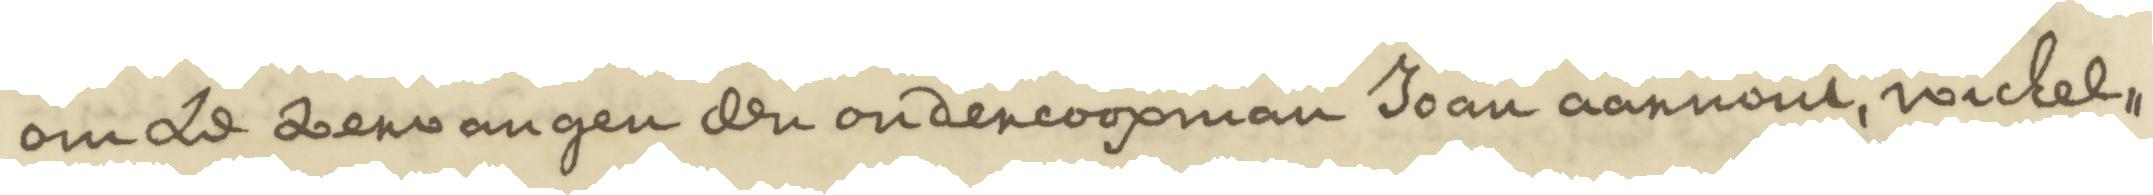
om te vervangen den ondercoopman Ioan aarnout, wichel„
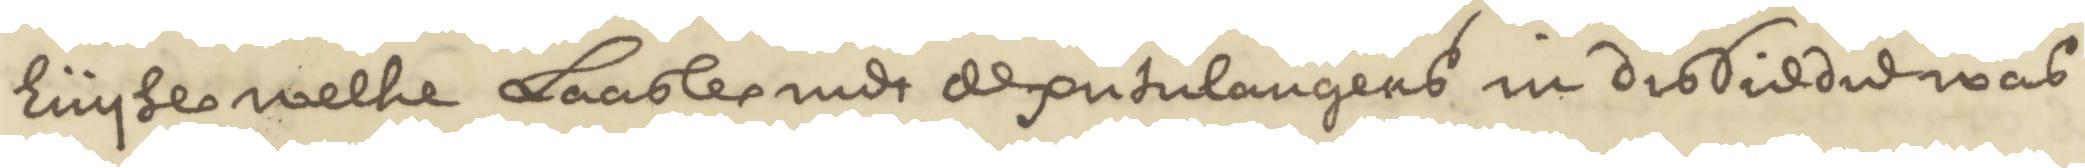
huijse welke laaste met de putulangers in dissiedie was
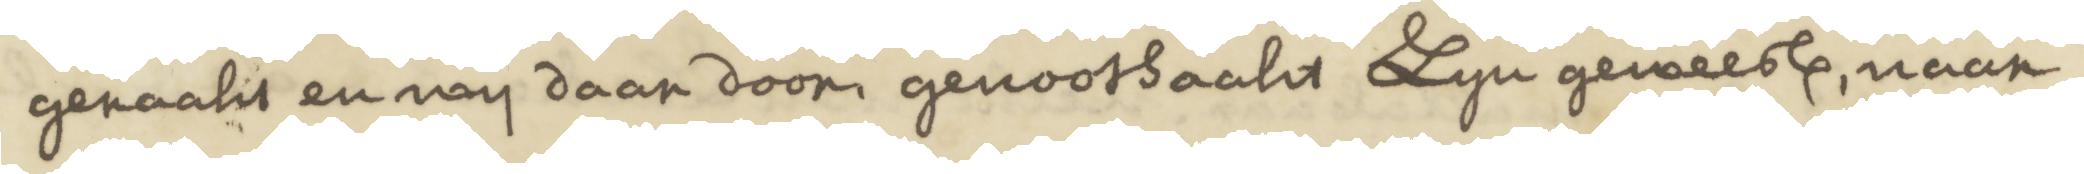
geraakt en wij daar door genootsaakt zijn geweest, naar
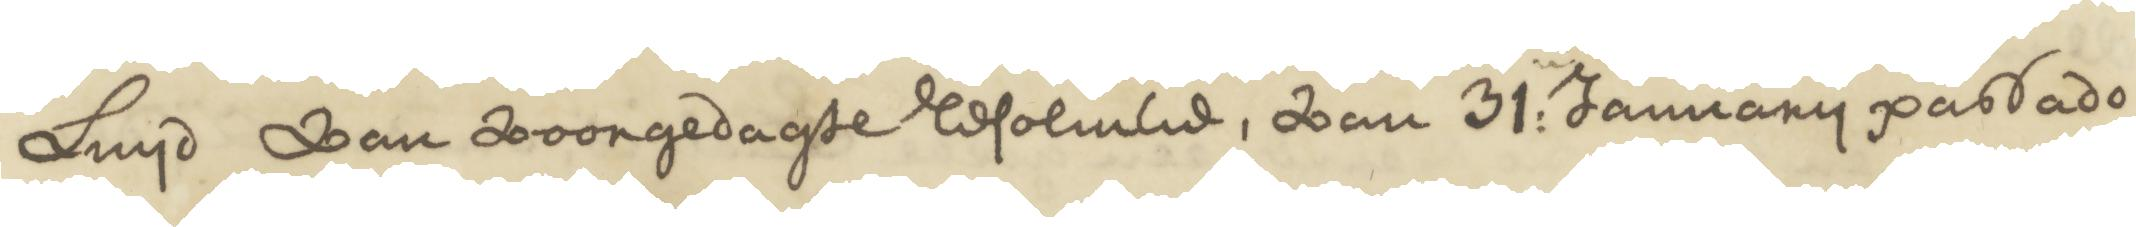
Luyd van voorgedagte resolutie, van 31: Ianuarij passado
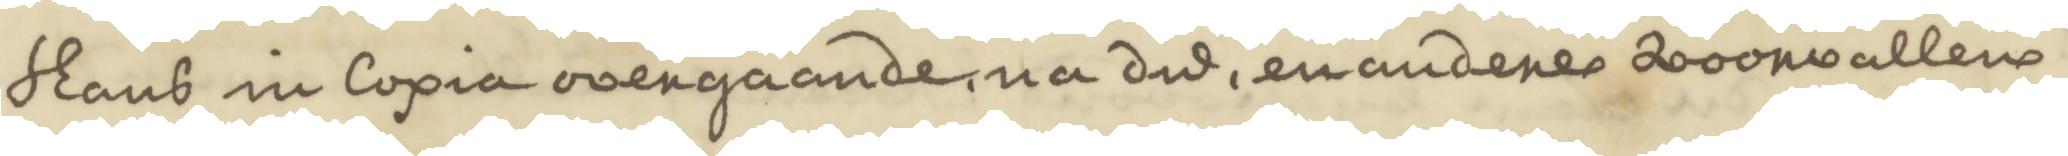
thans in Copia overgaande, na die, en andere voorvallen
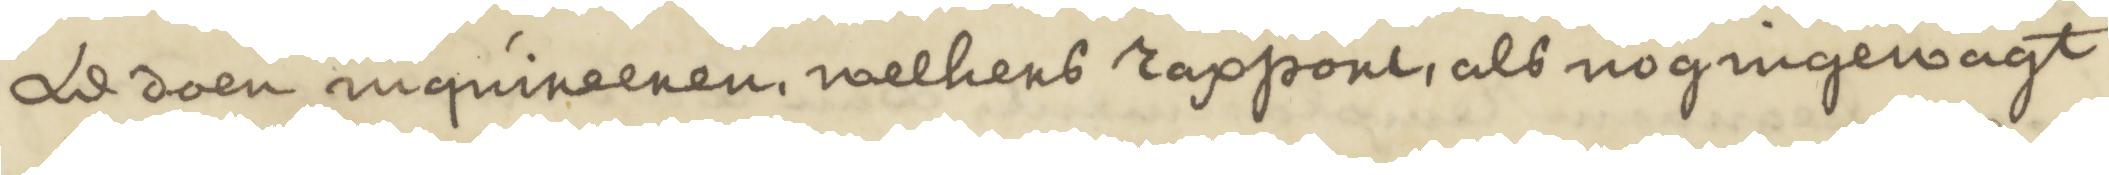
te doen inquireeren, welkers rapport, als nog ingewagt
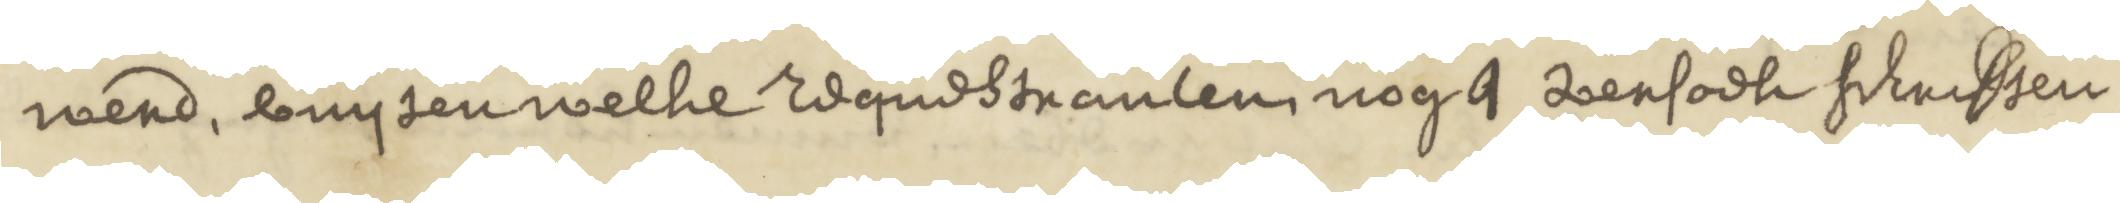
werd, buijten welke requestranten, nog 4 versoek schriften
